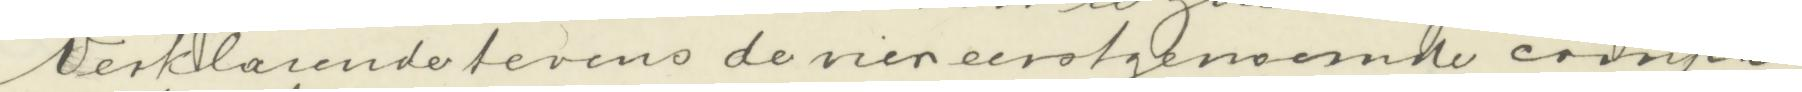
Verklarende tevens de vier eerstgenoemde compa
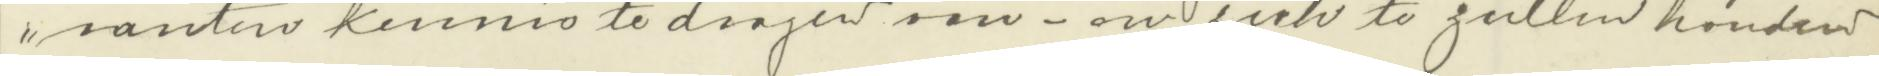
„ranten kennis te dragen van- en zich te zullen houden
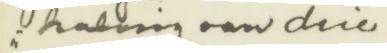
„haling van drie
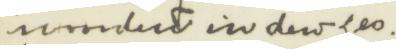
woorden in den zes
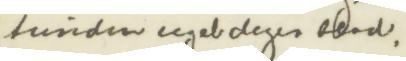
tienden regel dezes blad.
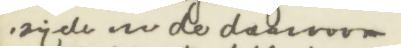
zijde en de daarvoor
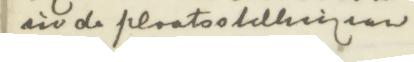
in de plaatsstelling van
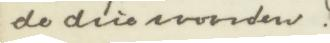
de drie woorden
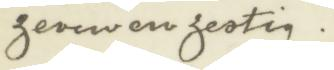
zeven en zestig.
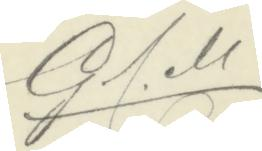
G C.M
